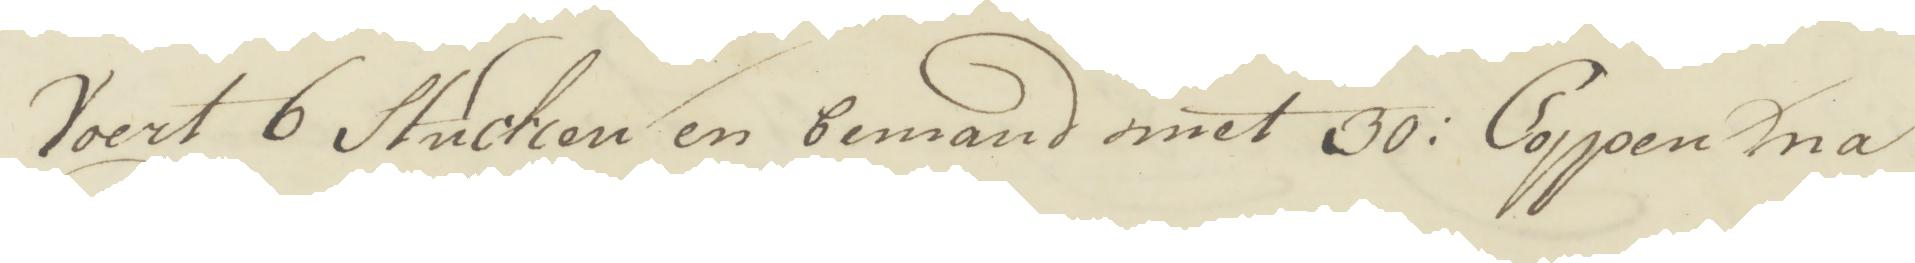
voert 6 stucken en bemand met 30: Coppen na
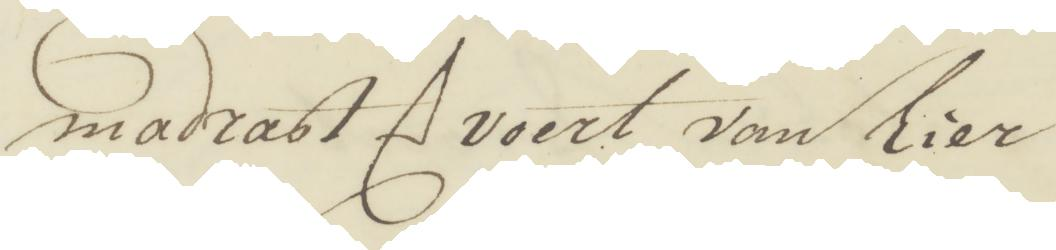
madrast vervoert van hier
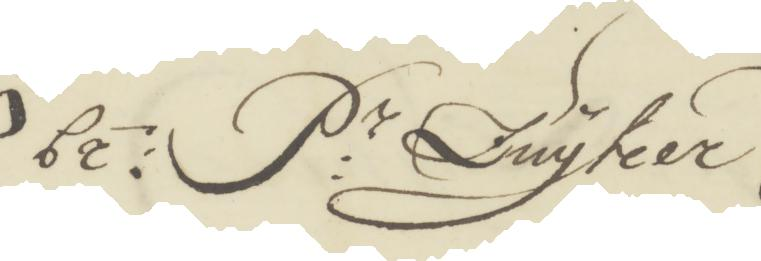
150 P=ls br: P:r Zuijker
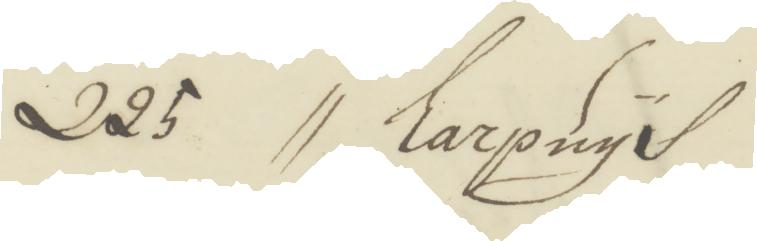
225 „ harpuijs
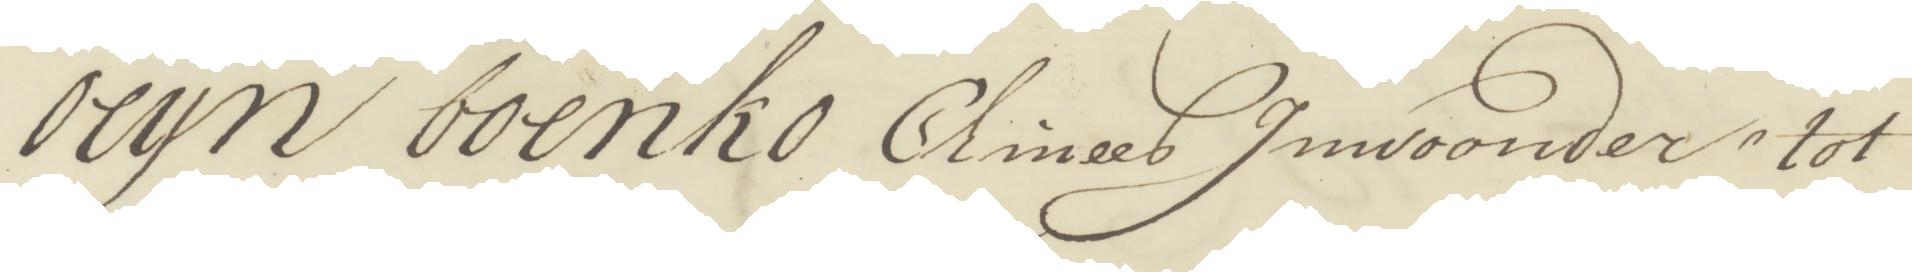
oeijn boenko Chinees Jnwoonder, tot
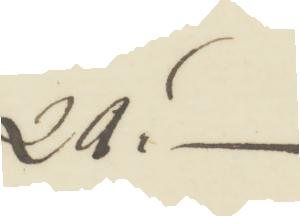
24.' _:o
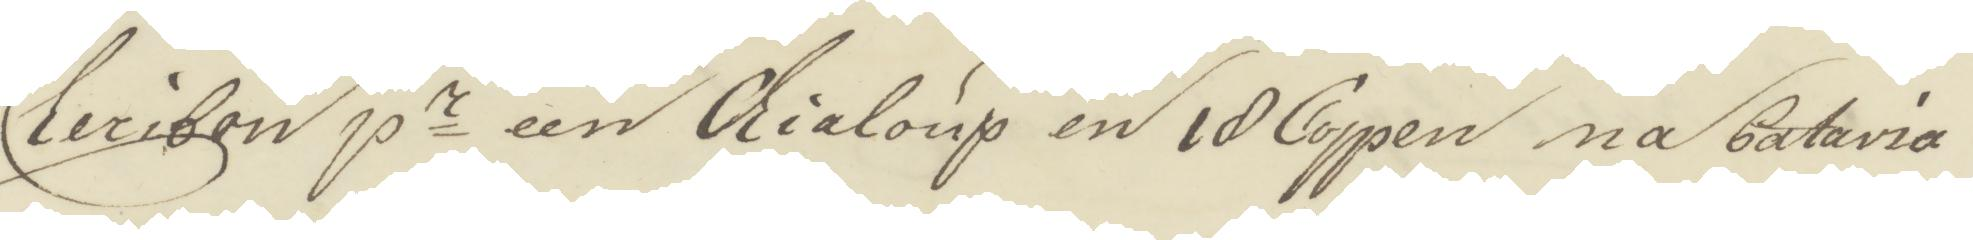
Cheribon p=r een Chialoup en 18 Coppen na batavia
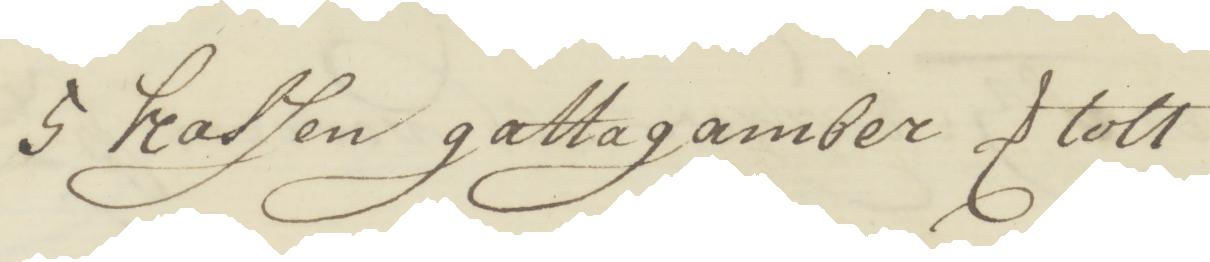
5 kassen gattagamber vertolt
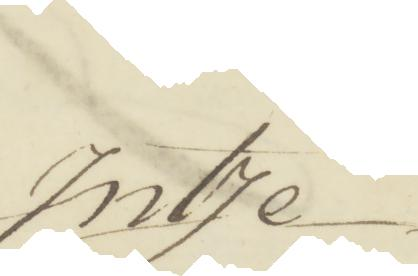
JntJe
